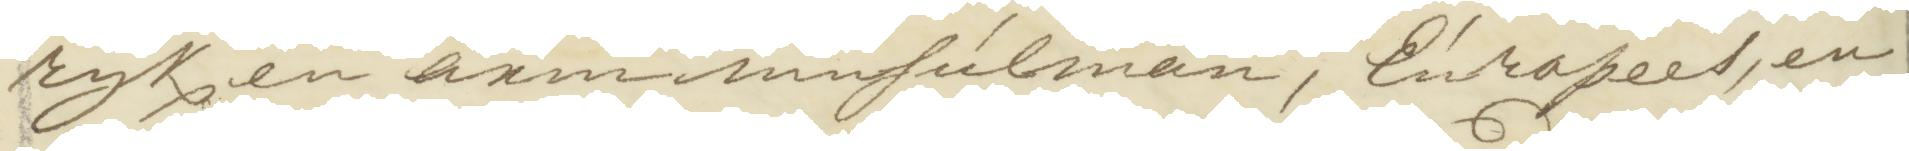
rijk en arm musulman, Europees, en
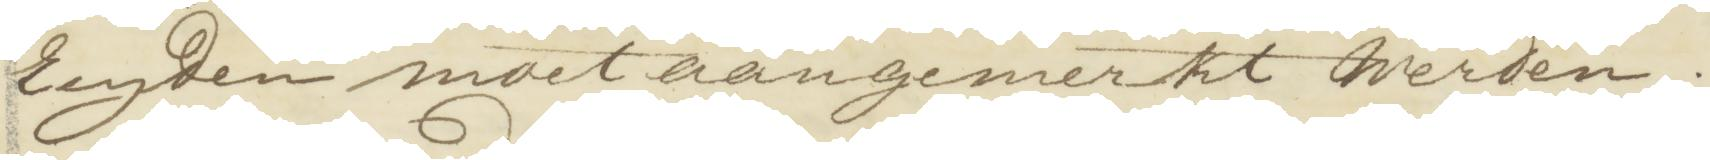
heyden moet aangemerkt werden.
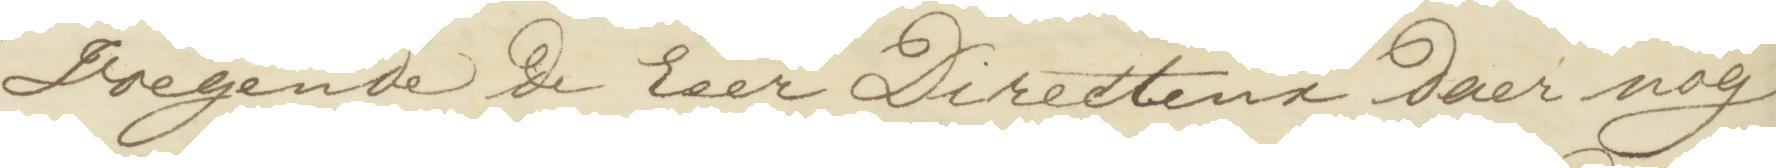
Voegende de heer Directeur daer nog
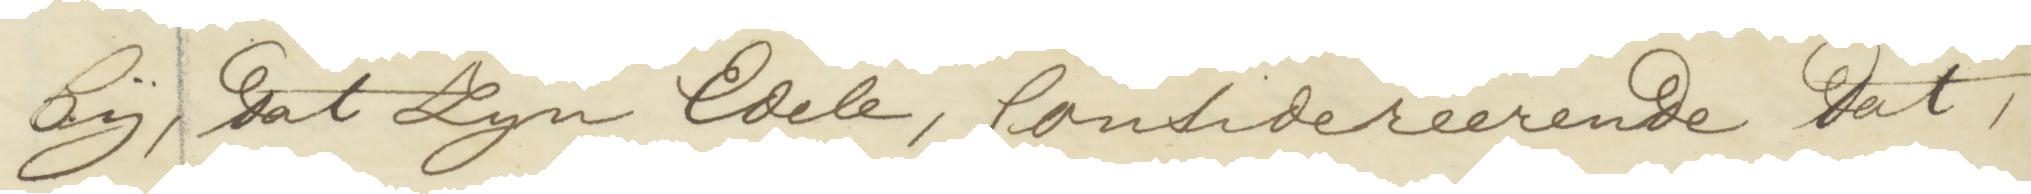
bij, dat zijn Edele, considereerende dat,
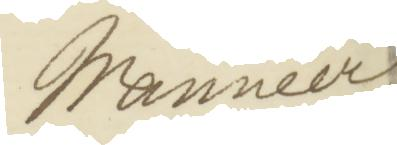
Wanneer
